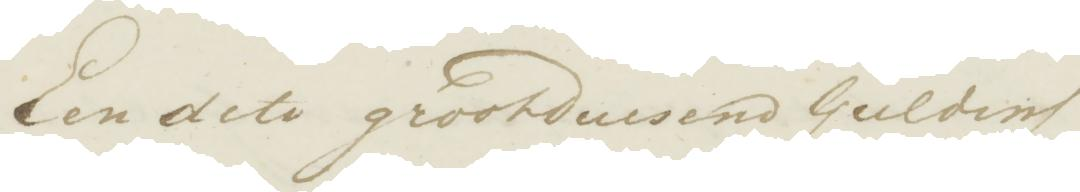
Een dito groot duisend Guldens
